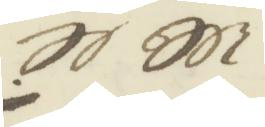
W W
